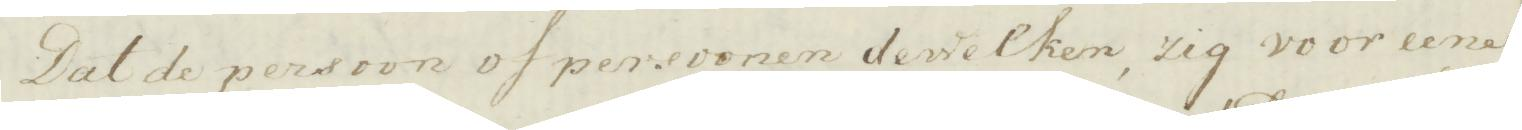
Dat de persoon of persoonen dewelken, zig voor eene
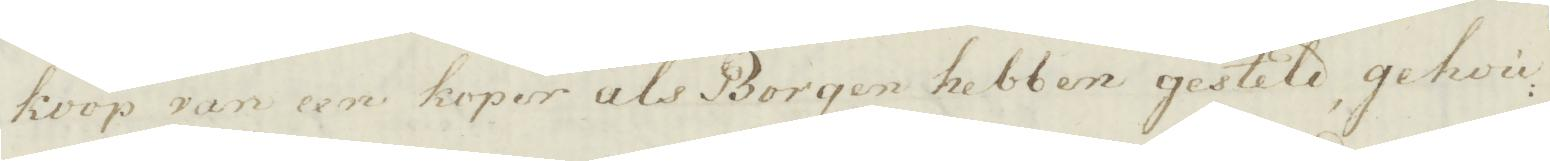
koop van een koper als Borgen hebben gesteld, gehou:
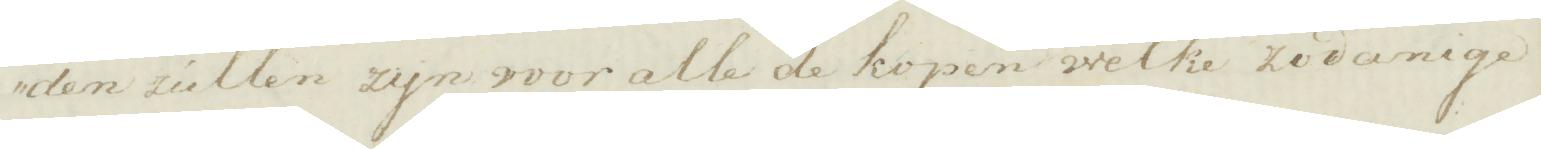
den zullen zijn voor alle de kopen welke zodanige
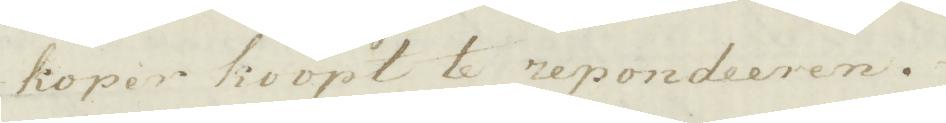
koper koopt te repondeeren.
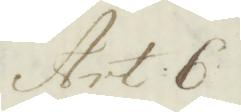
Art: 6
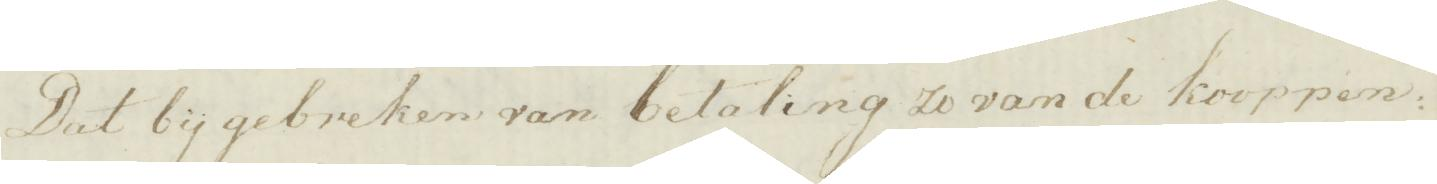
Dat bij gebreken van betaling zo van de kooppen:
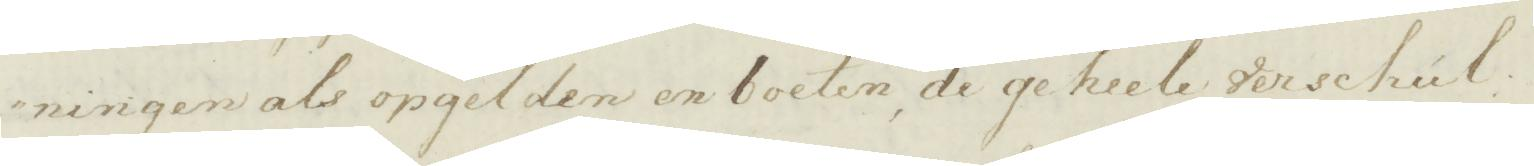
„ningen als opgelden en boeten, de geheele verschul:
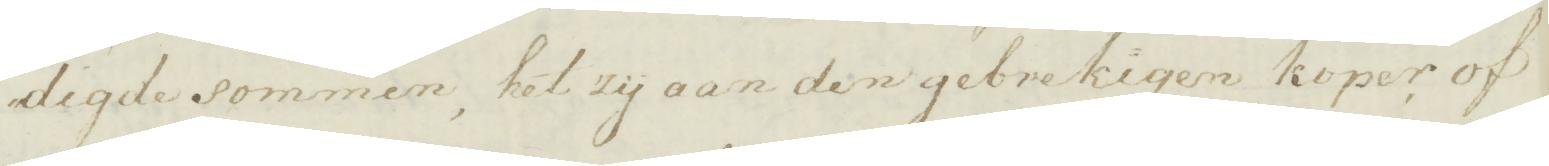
digde sommen, het zij aan den gebrekigen koper, of
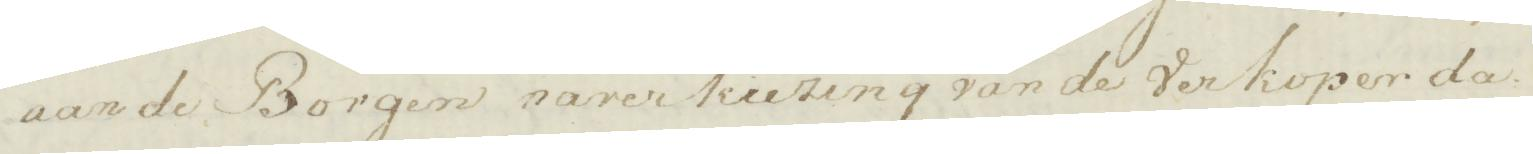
aan de Borgen naverkiezing van de verkoper da:
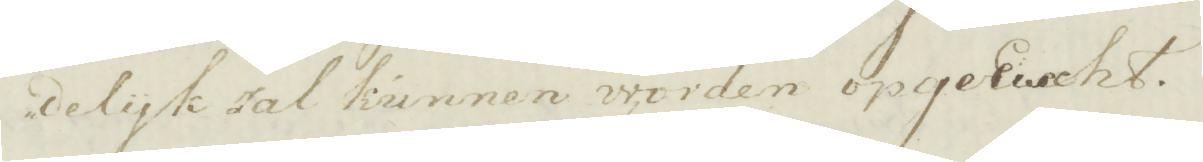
„delijk zal kunnen worden opgeEischt.
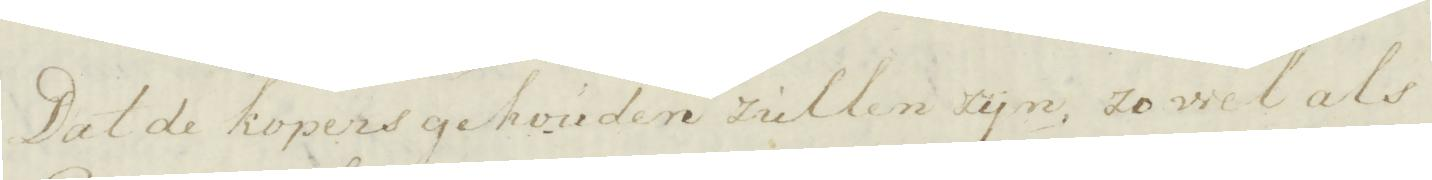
Dat de kopers gehouden zullen zijn, zo wel als
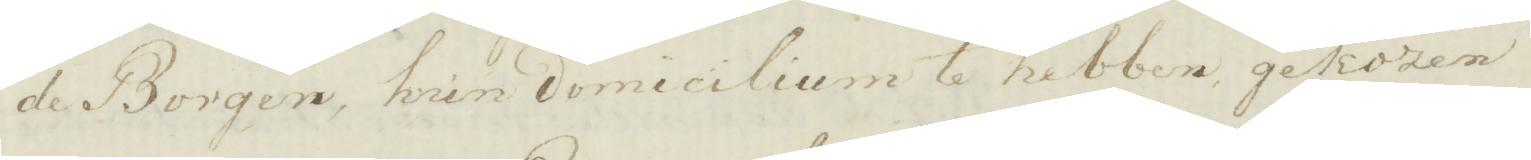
de Borgen, hun domicilium te hebben, gekozen
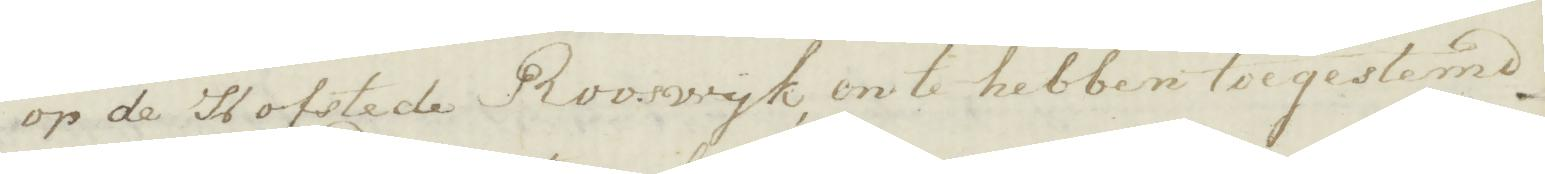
op de Hofstede Rooswijk, en te hebben toegestemd
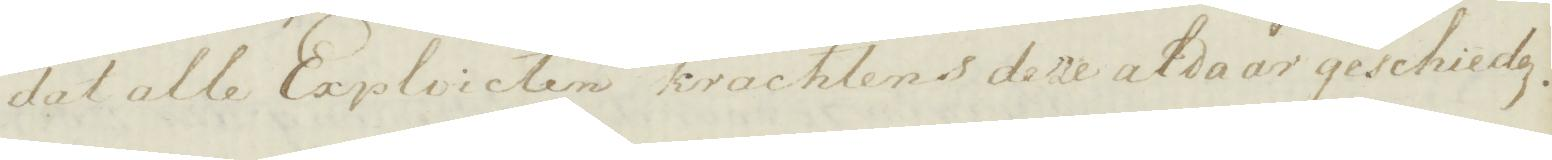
dat alle Exploicten krachtens deze aldaar geschieden.
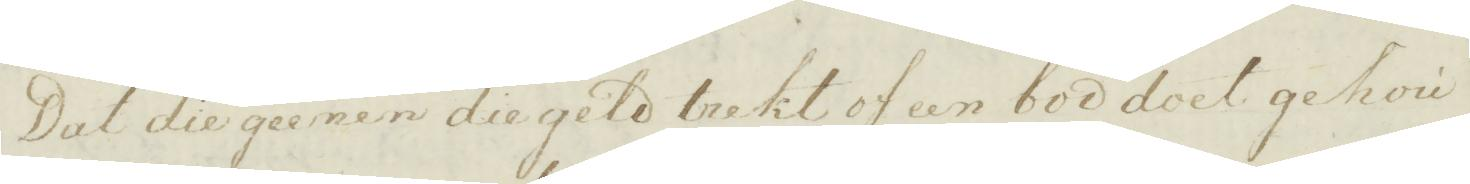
Dat die geenen die geld trekt of een bod doet gehou
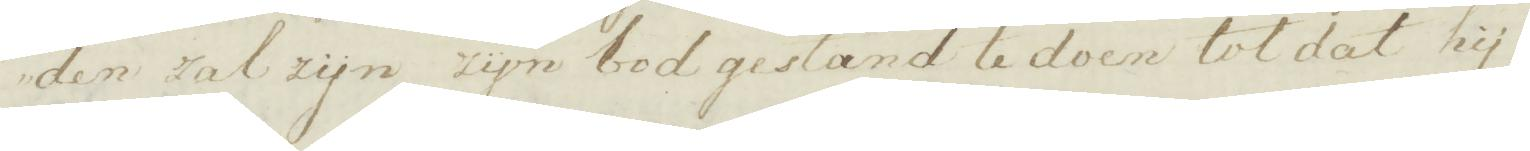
„den zal zijn zijn bod gestand te doen tot dat hij
